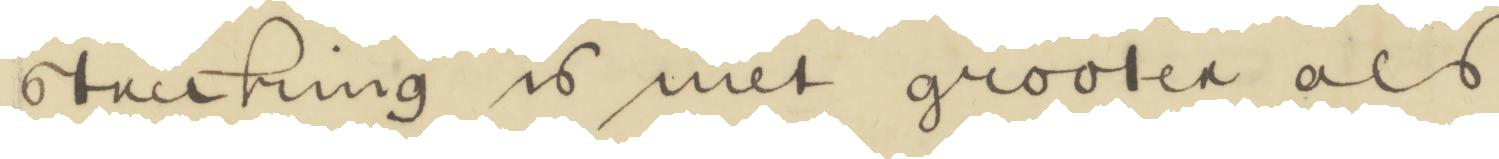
strecking is niet grooter als
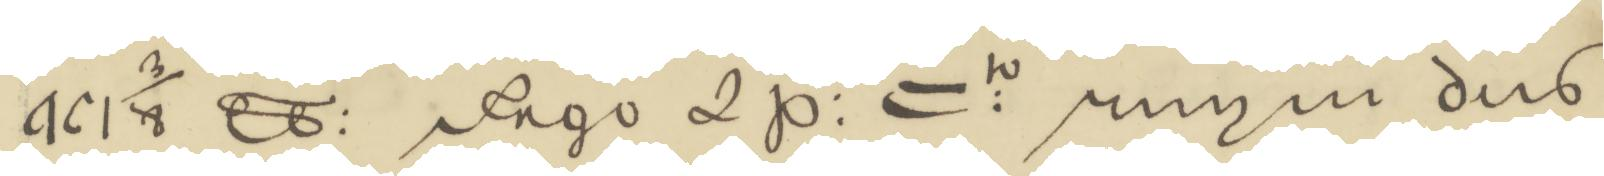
451 3/8 lb: Ergo 2 p:r c:to ruijm dus
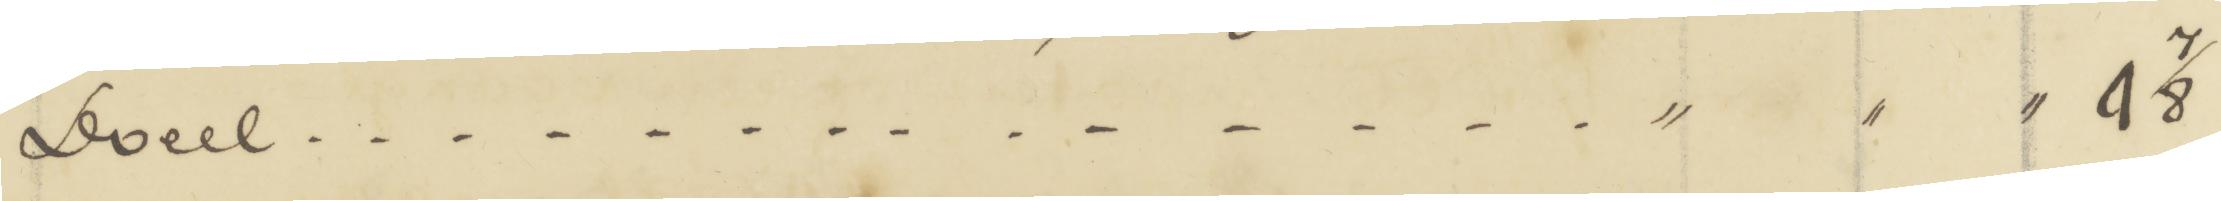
teveel - - - - - - - - - - - - - - „ „ „ 4 7/8
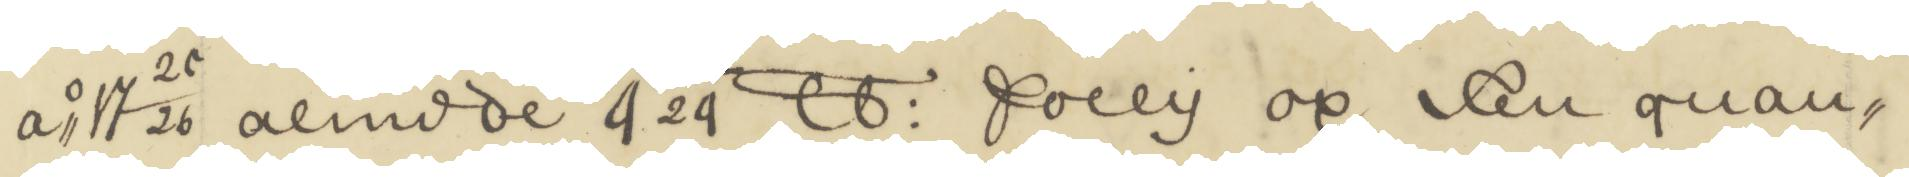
a„o 17 25/26 almede 4 23/24 lb: foelij op Een quan„
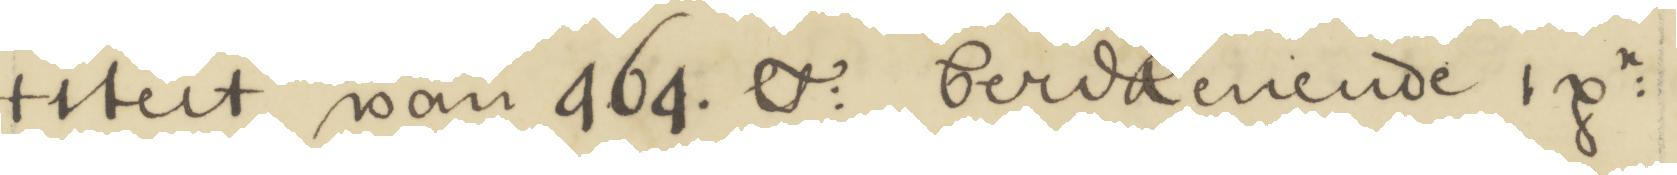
titeit van 464. lb: berekenende 1 p:r
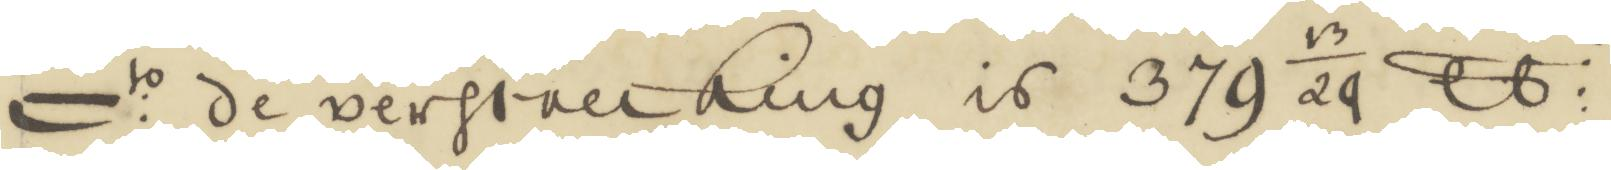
C:to de verstrecking is 379 13/24 lb:
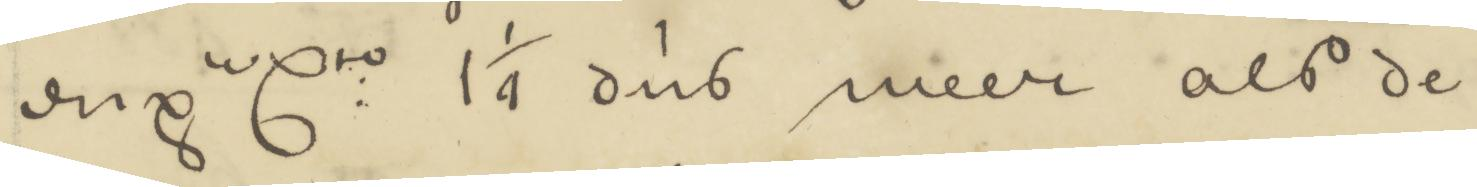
en p:r C:to 1 ¼ dus meer als de
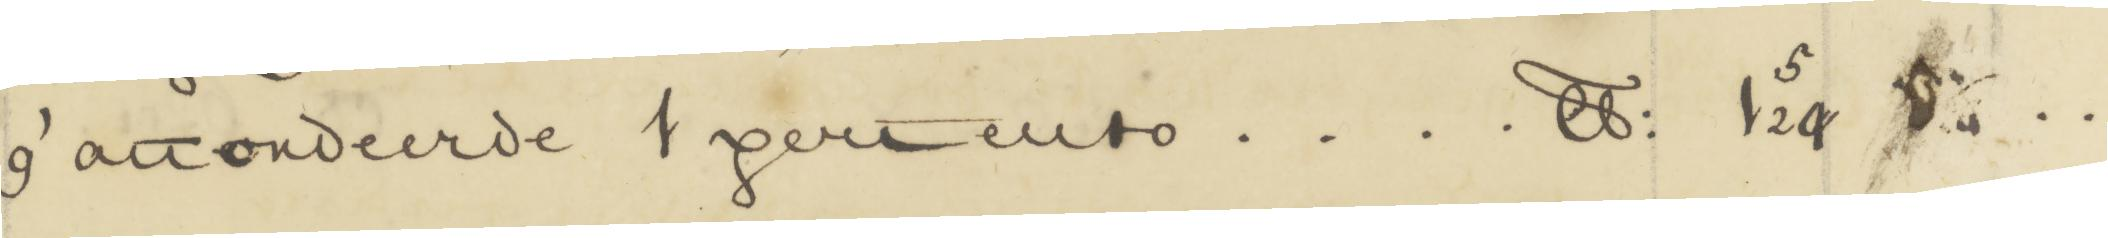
g’accordeerde 1 percento . . . . lb: 1 5 24 8 3/4 ..
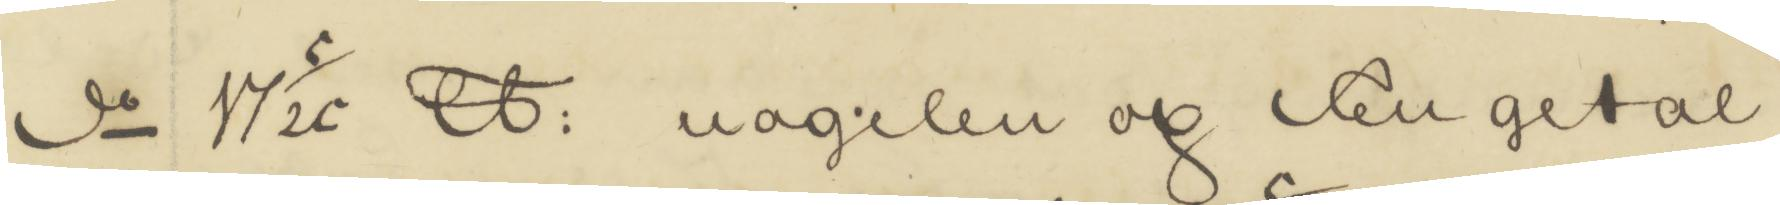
d=o 17 5/25 lb: nagelen op Een getal
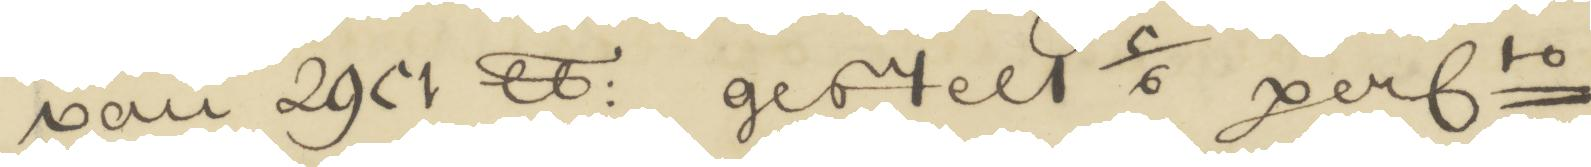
van 2951 lb: gestelt 5/6 perc=to
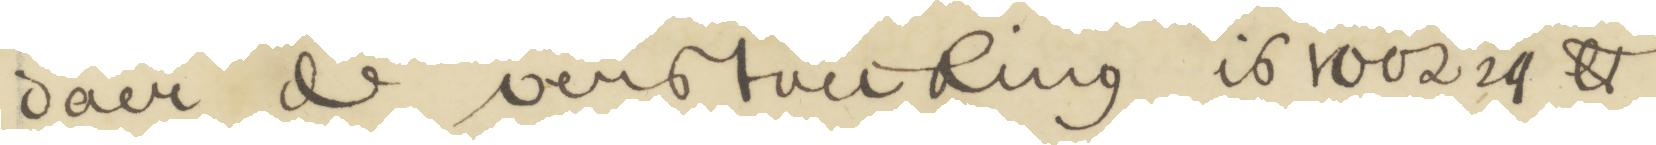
daer de verstrecking is 1002 7/24 lb
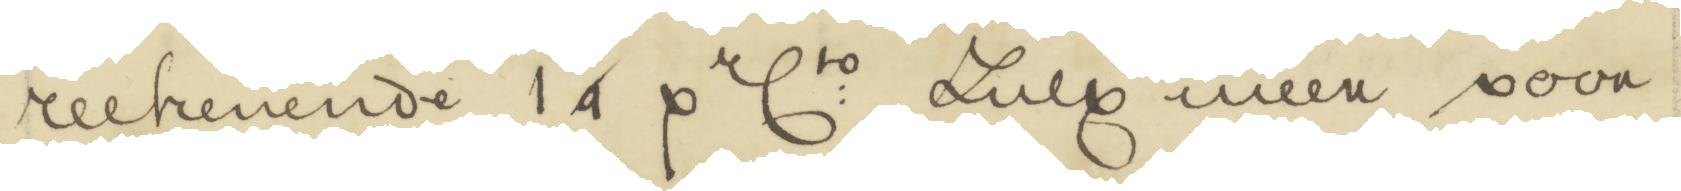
reekenende 1 ¾ p:r C:to zulx meer voor
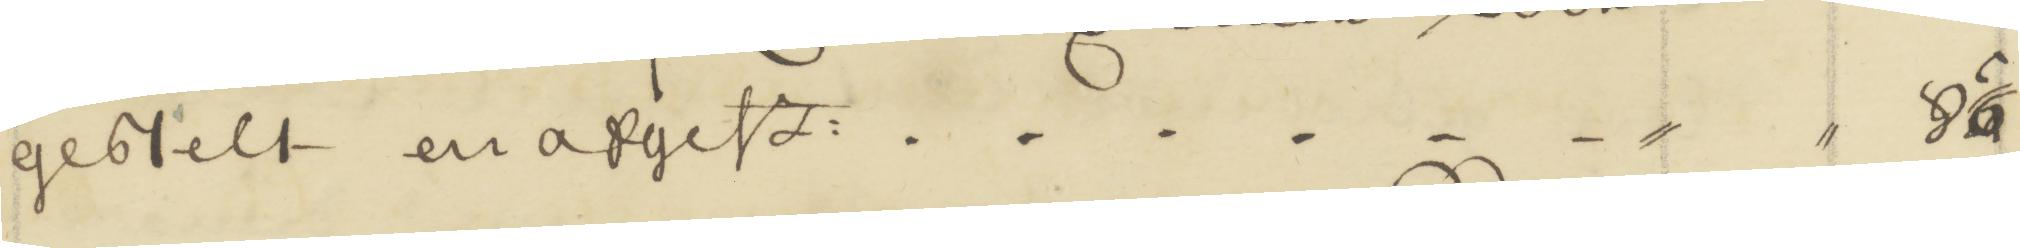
gestelt en afgesz: . - - - - - „ 8 5/6
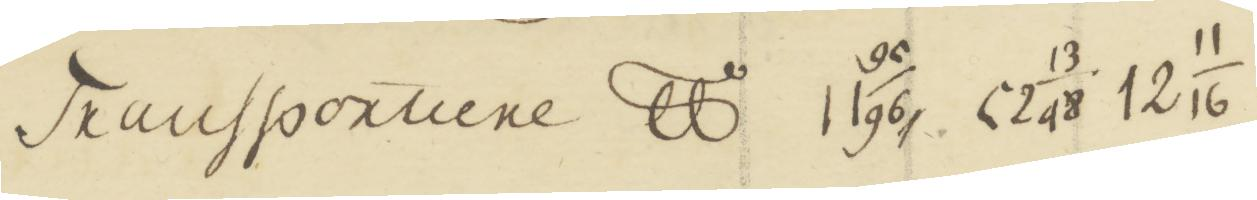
Transporteere lb 11 95/96„ 52 13/48 12 11/16
